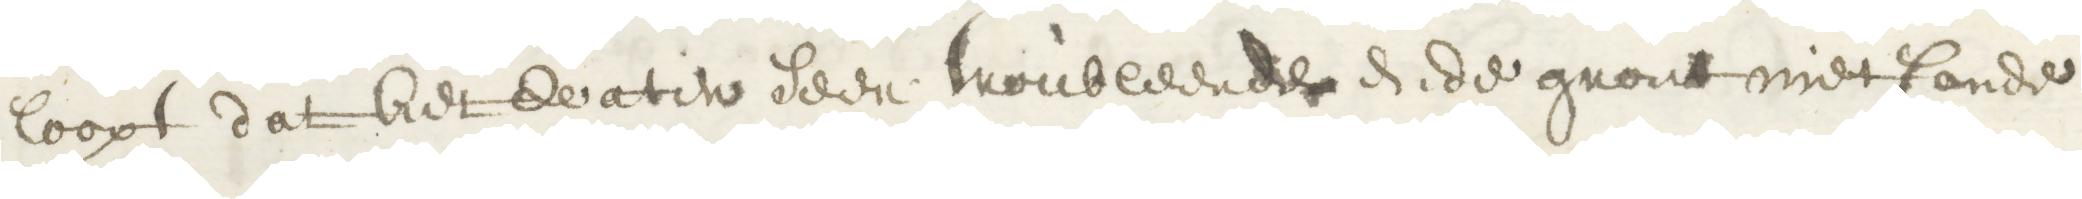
loopt dat het water Seer troubleerde en de gront niet Conde
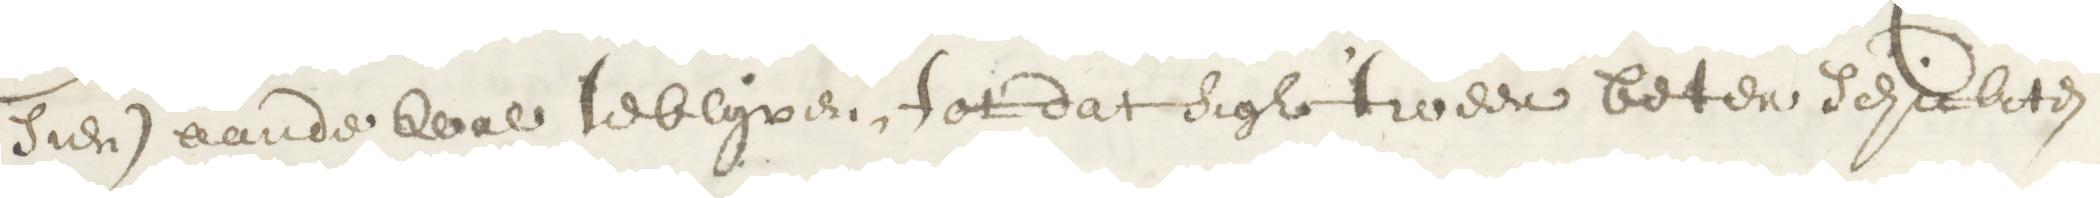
sien) aande wal teblijven, tot dat sigh 'tweer beter Schickten
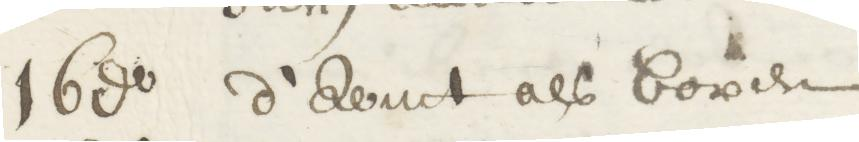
16 do d’ wint als boven
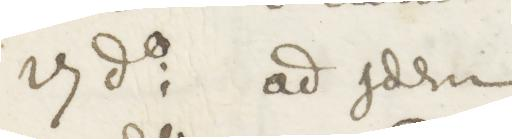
17 d:o ad jdem
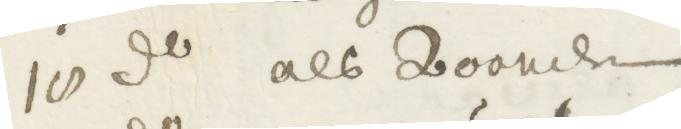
18 d:o als vooren
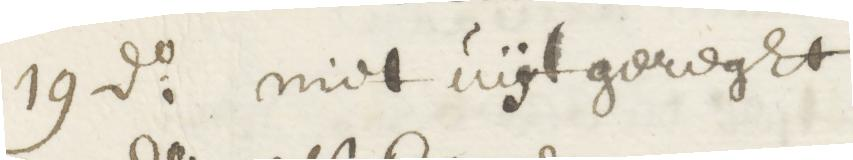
19 d:o niet uijtgereght
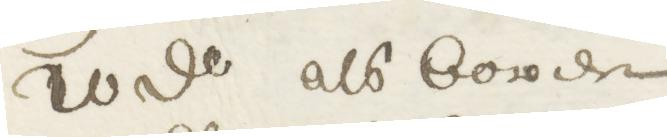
20 d:o als boven
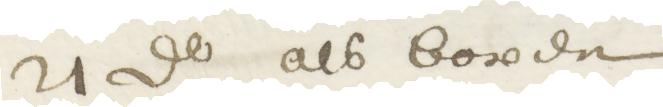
21 d:o als boven
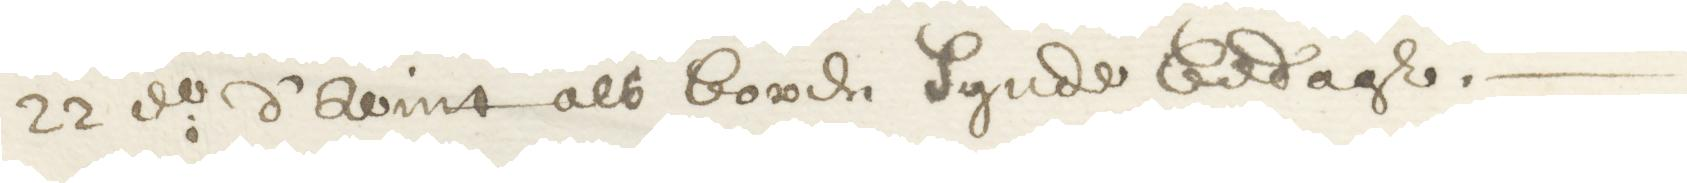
22 d:o d’ wint als boven Synde bedagh. —
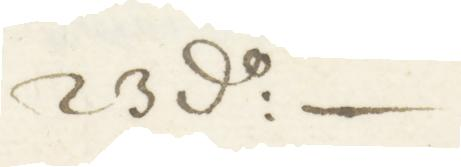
23 d:o —
